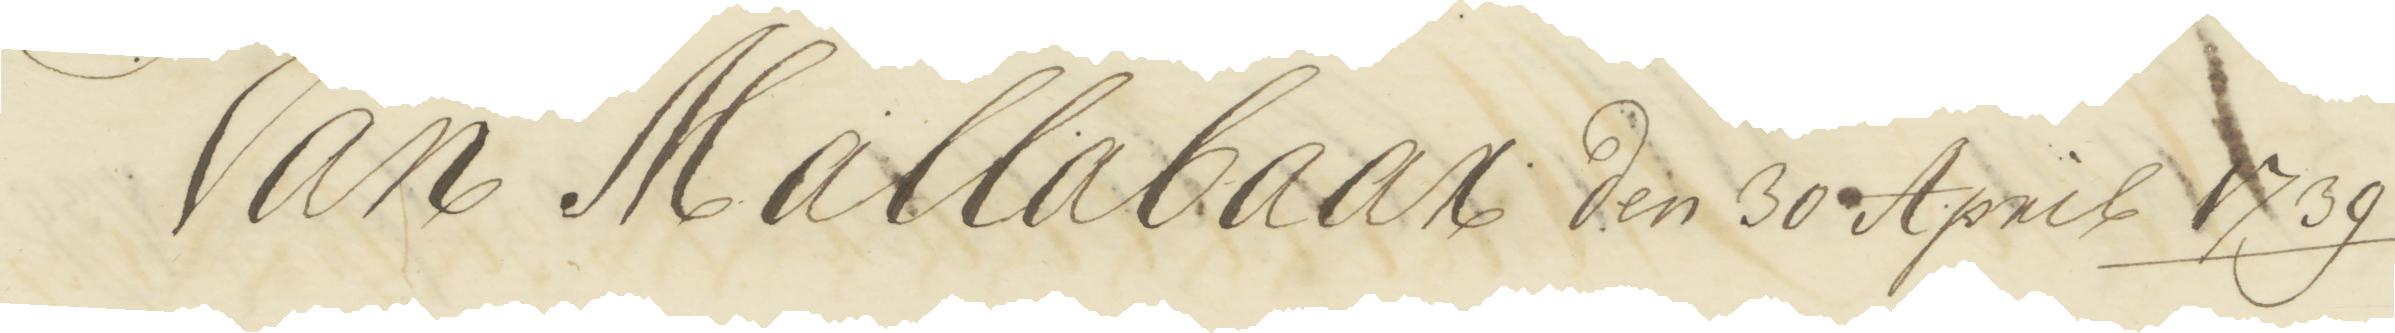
Van Mallabaar den 30 April 1739
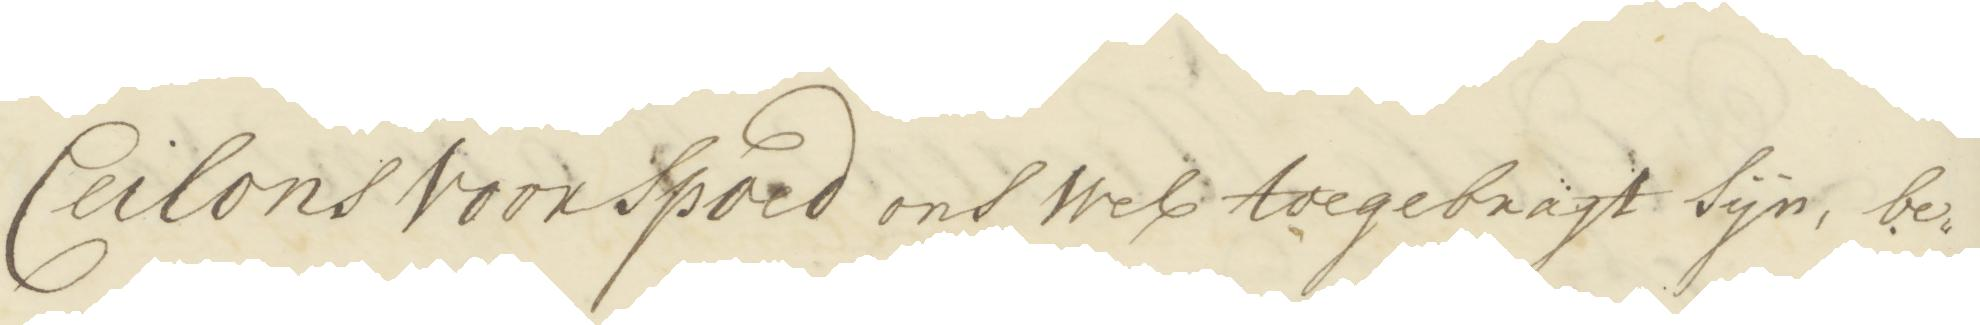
Ceilons voorspoed ons wel toegebragt sijn, be„
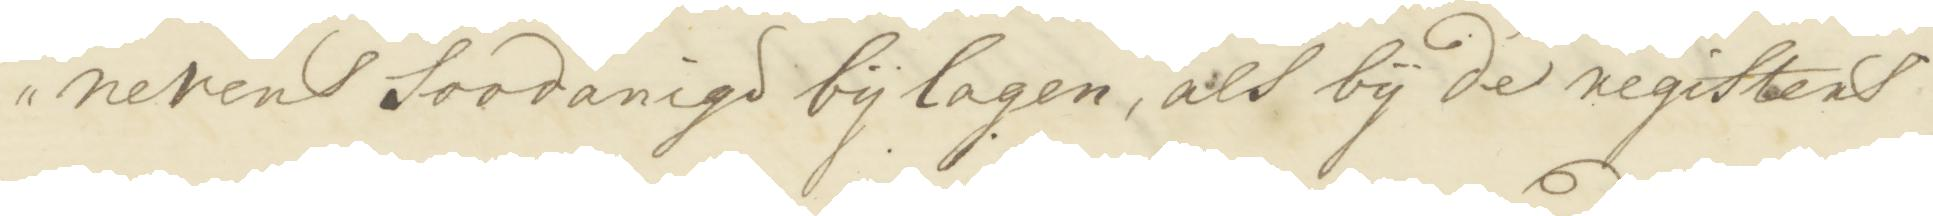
„nevens soodanigd bij lagen, als bij de registers
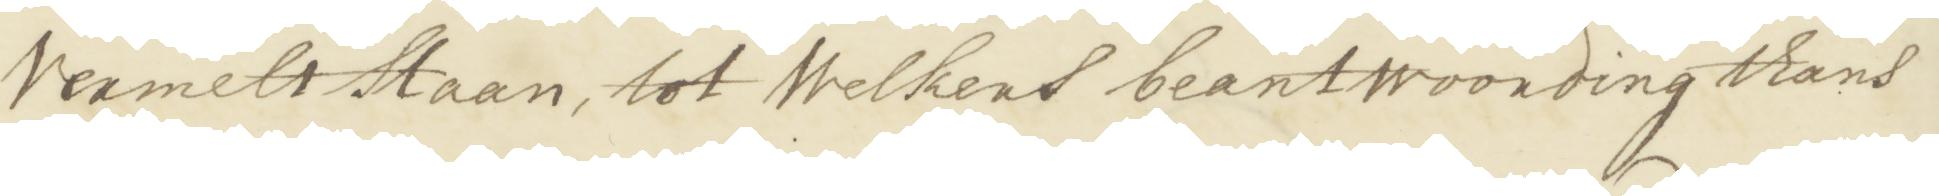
vermelt staan, tot welkers beantwoording thans
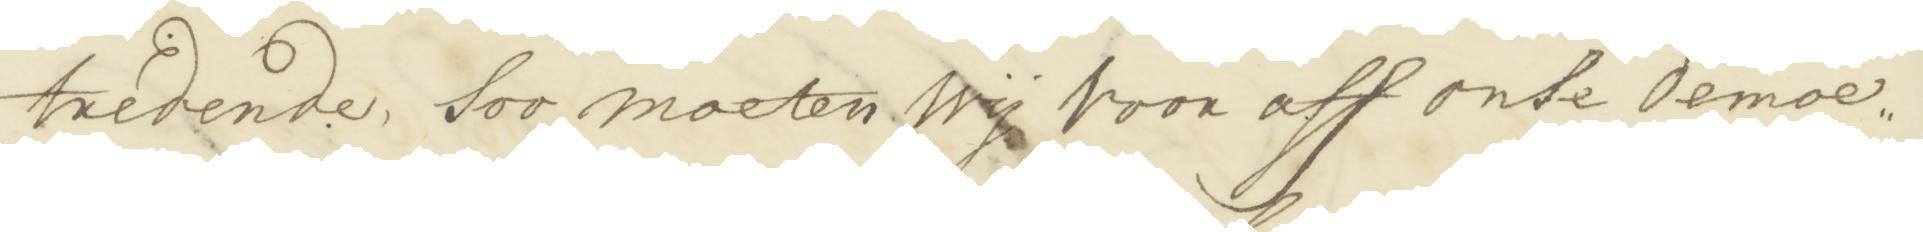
tredende, soo moeten wij voor aff onse demoe„
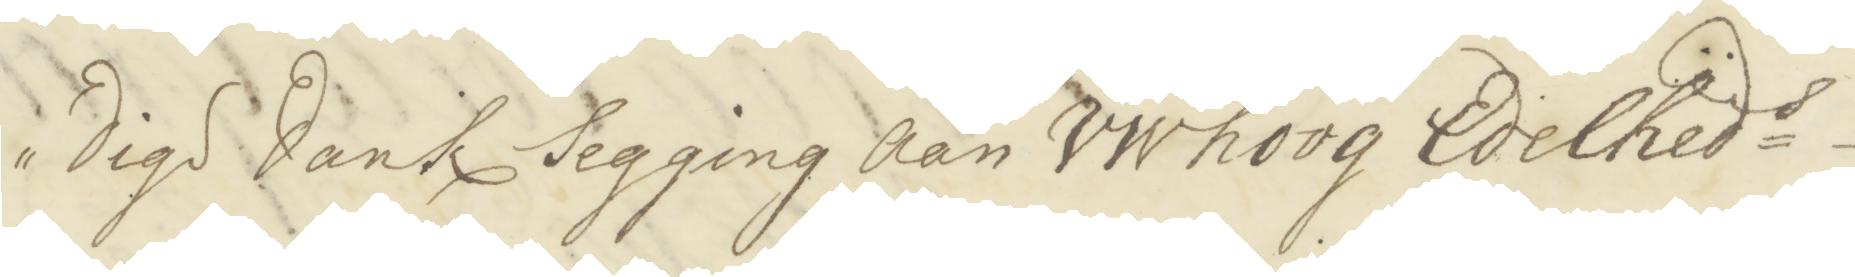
„dige dank segging aan VW hoog Edelhed=s
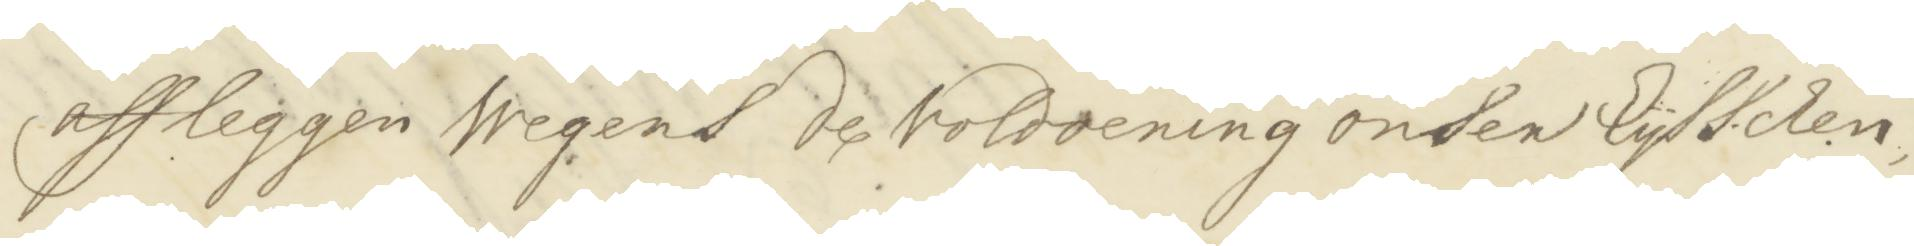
affleggen wegens de voldoening onser Eijsschen,
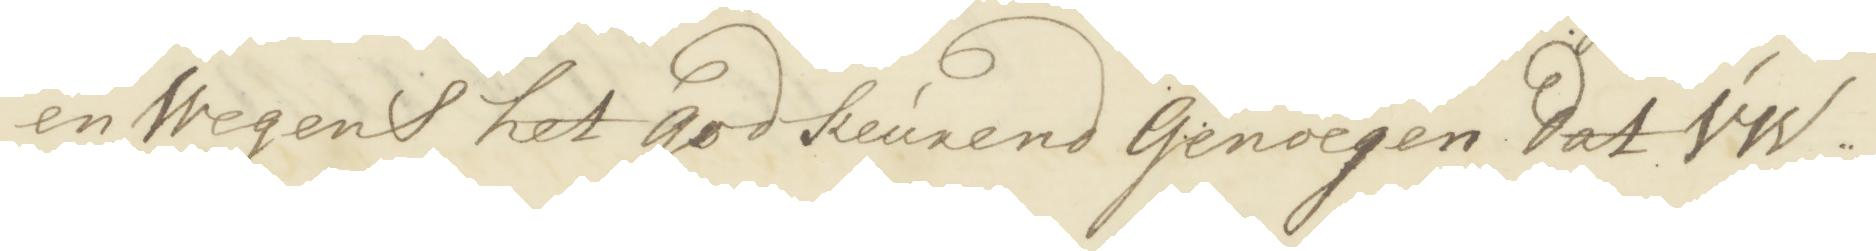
en wegens het god keurend genoegen dat VW
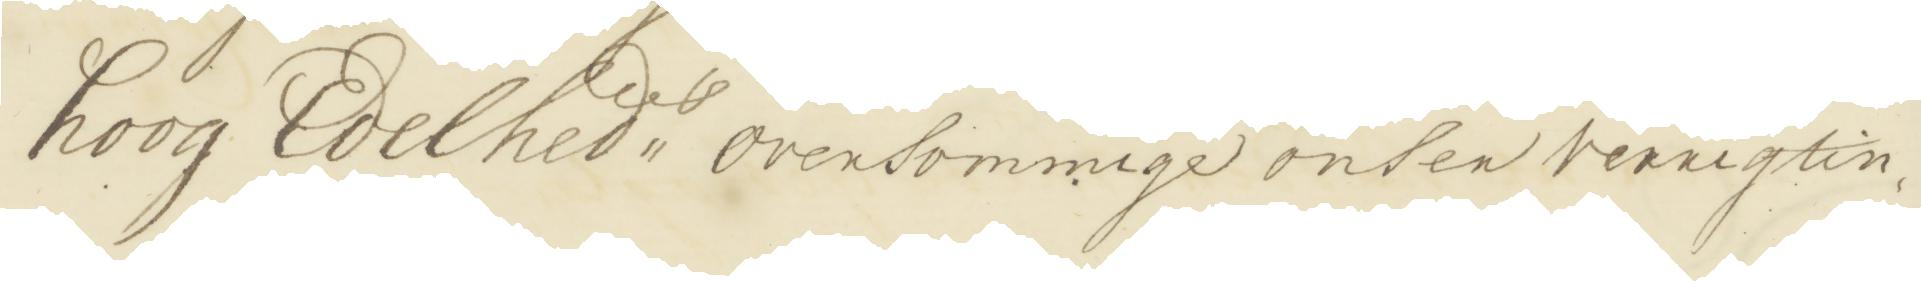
hoog Edelhed„s over sommige onser verrigtin„
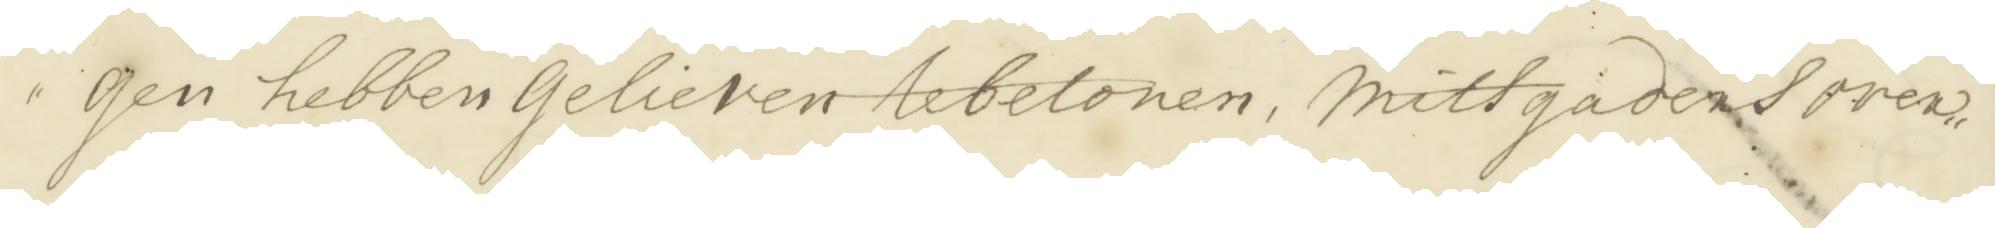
„gen hebben gelieven tebetonen, mitsgaders over„
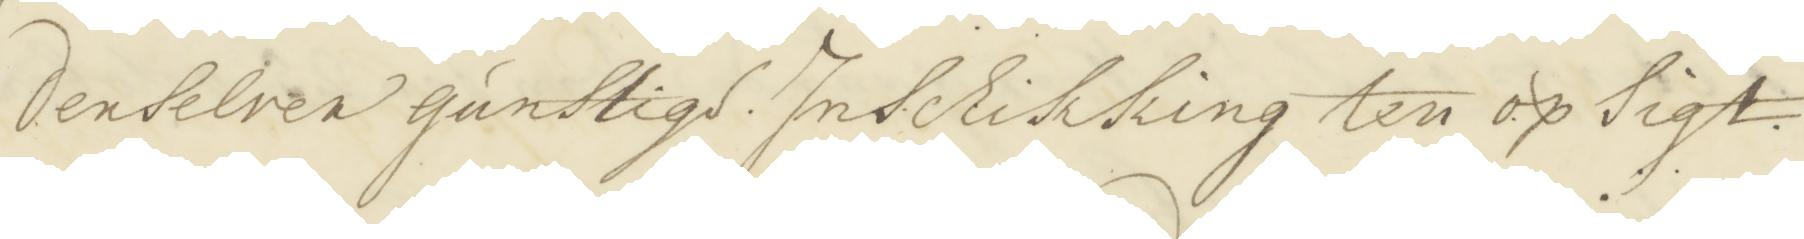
derselver gunstigs. Jnschikking ten op sigt
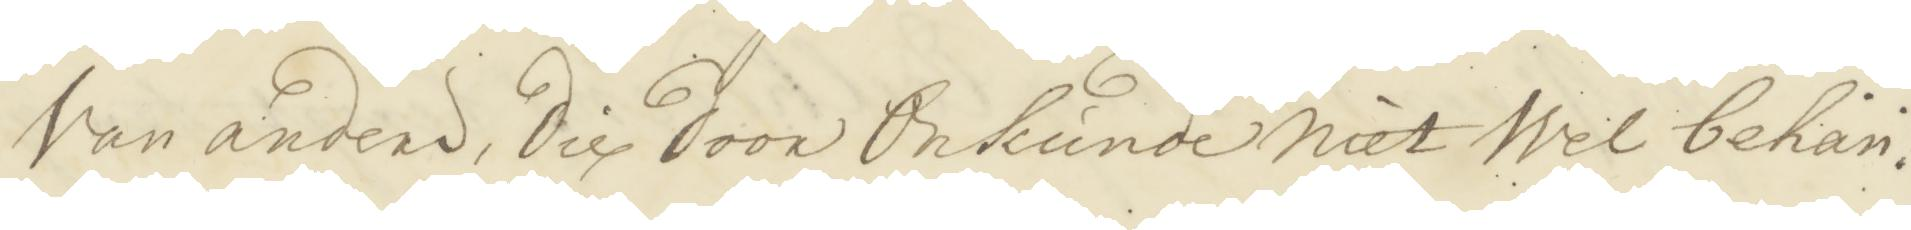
van andere, die door Onkunde niet wel behan„
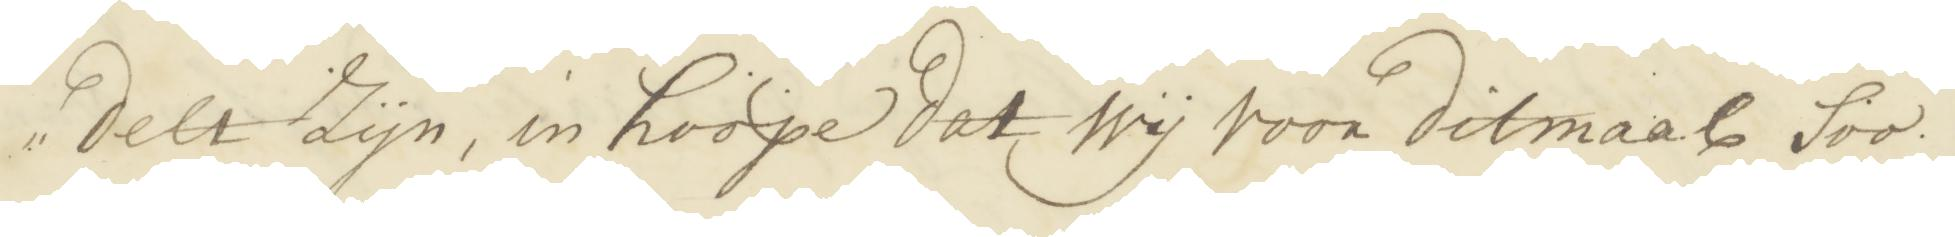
„delt zijn, in hoope dat wij voor ditmaal soo
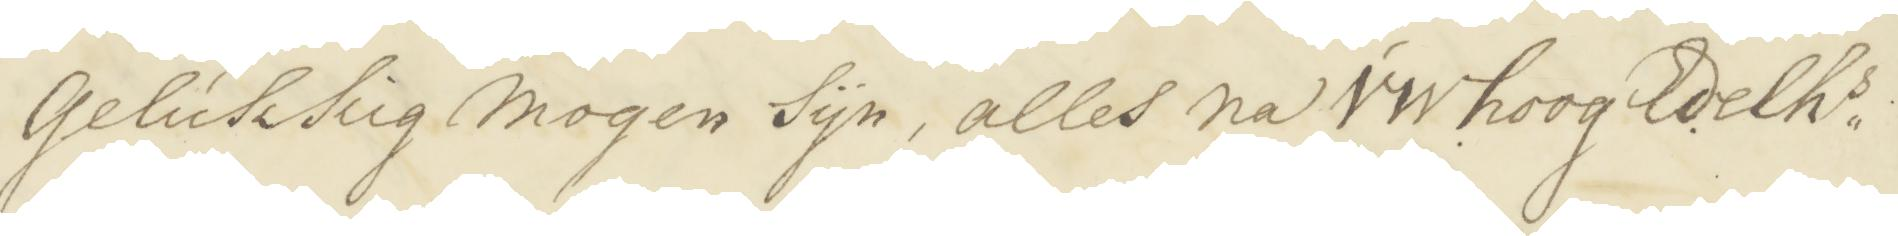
gelukkig mogen sijn, alles na VW hoog Edelh„s
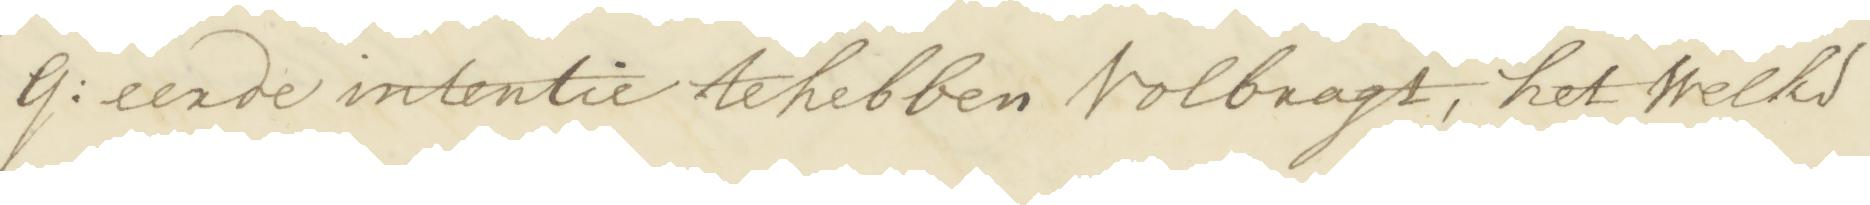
g:eerde intentie te hebben volbragt, het welks
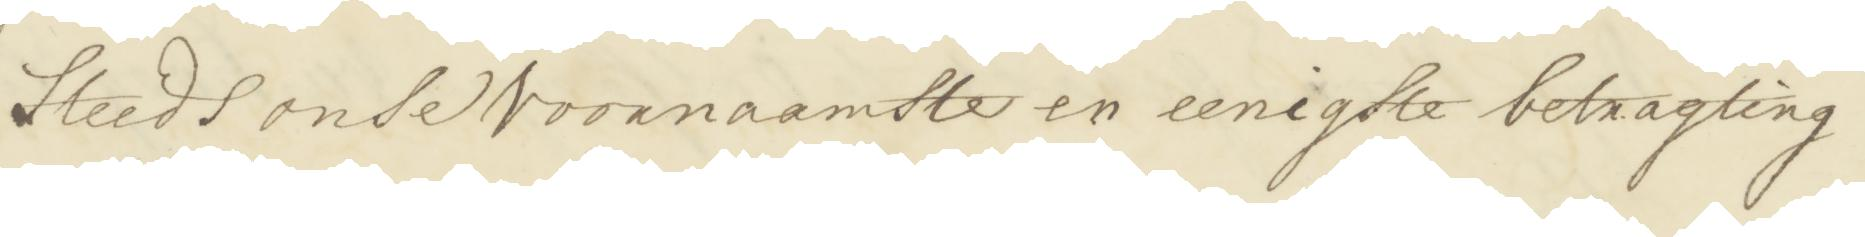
steeds onse voornaamste en eenigste betragting
